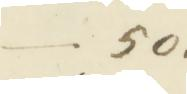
-. 50.
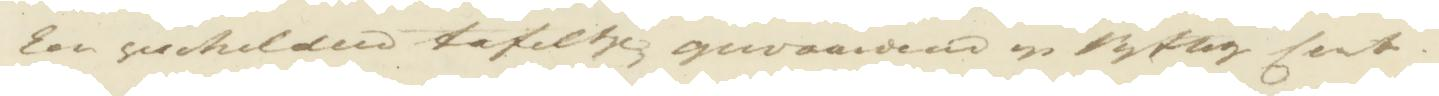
Een geschilderd tafeltje gewaardeerd op Vyftig Cent.
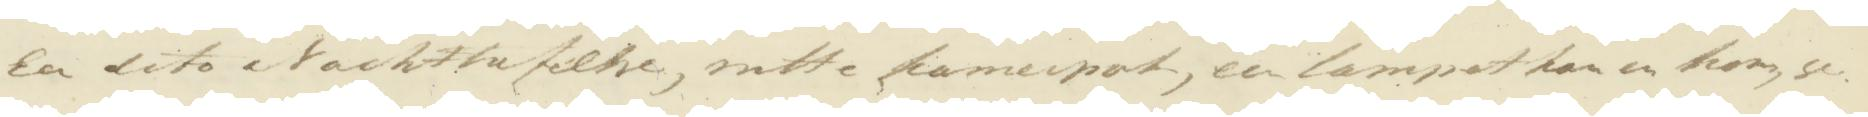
Een dito Nachttafeltje, witte kamerpot, een lampetkan en kom, ge
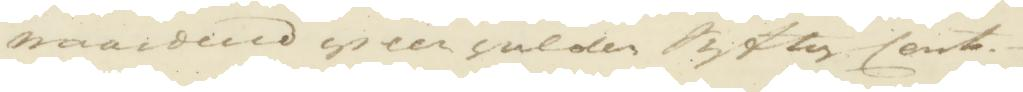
waardeerd op een gulden Vyftig Cent.
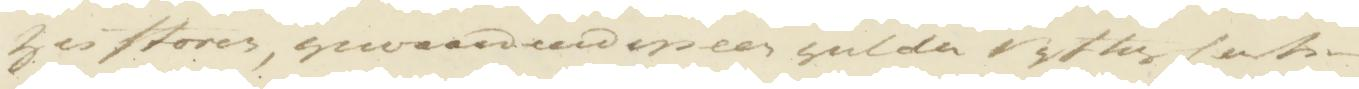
Zes stoven, gewaardeerd op een gulden vyftig Cents.
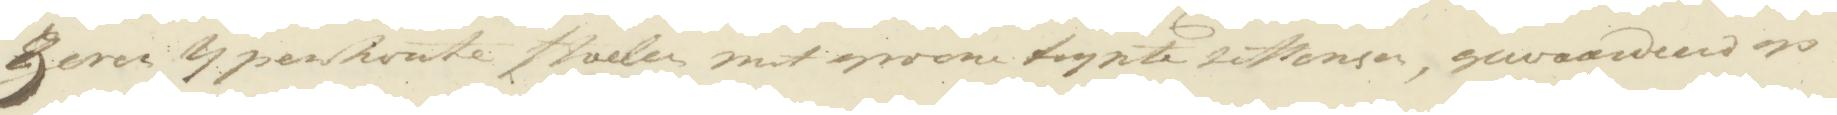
Zeven Yperhoute stoelen met groene trypte zittingen, gewaardeerd op
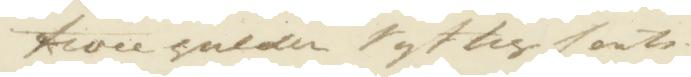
twee gulden Vyftig Cents.
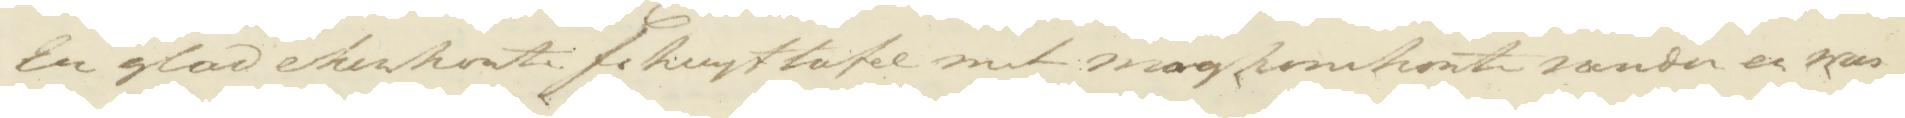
Een glad ekenhouten schryftafel met maghonihouten randen en was
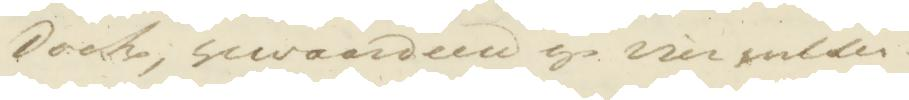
Doek, gewaardeerd op vier gulden
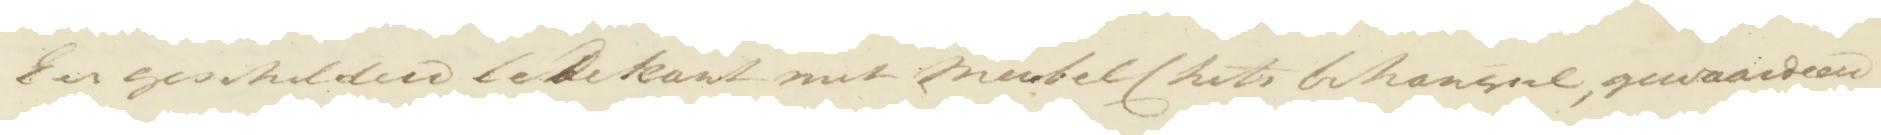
Een geschilderd ledikant met meubel Chits behangsel, gewaardeerd
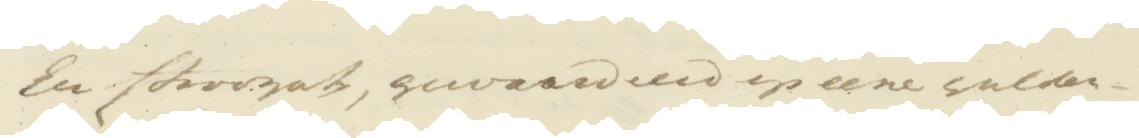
En Stroozak, gewaardeerd op eene gulden
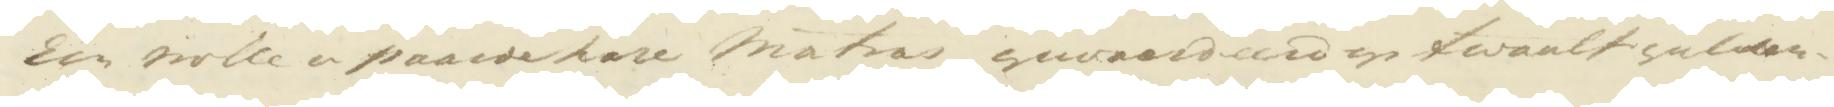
Een wolle en paardehare matras gewaardeerd op twaalf gulden
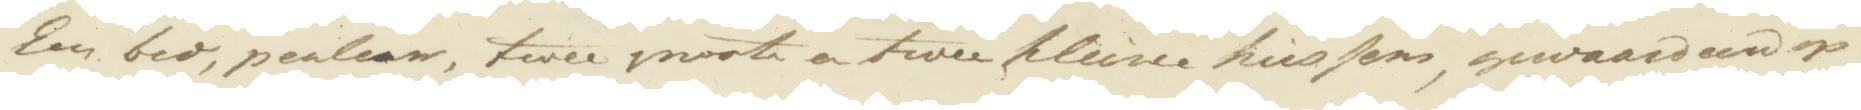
Een bed, peuluw, twee groote en twee kleine kussens, gewaardeerd op
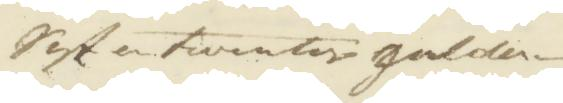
Vyf en twintig gulden
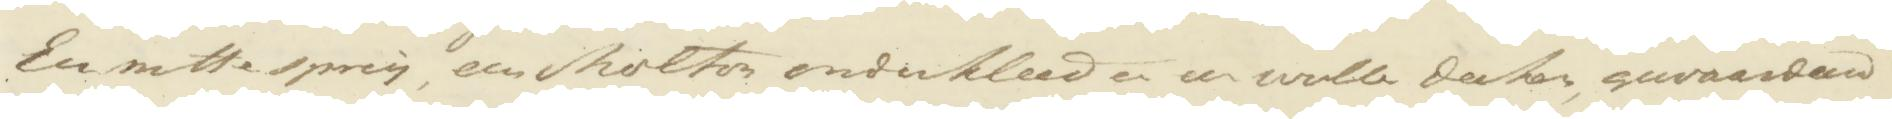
En nette spreij, een Molten onderkleed en een wollen deken, gewaardeerd
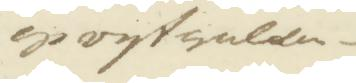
op vyf gulden
